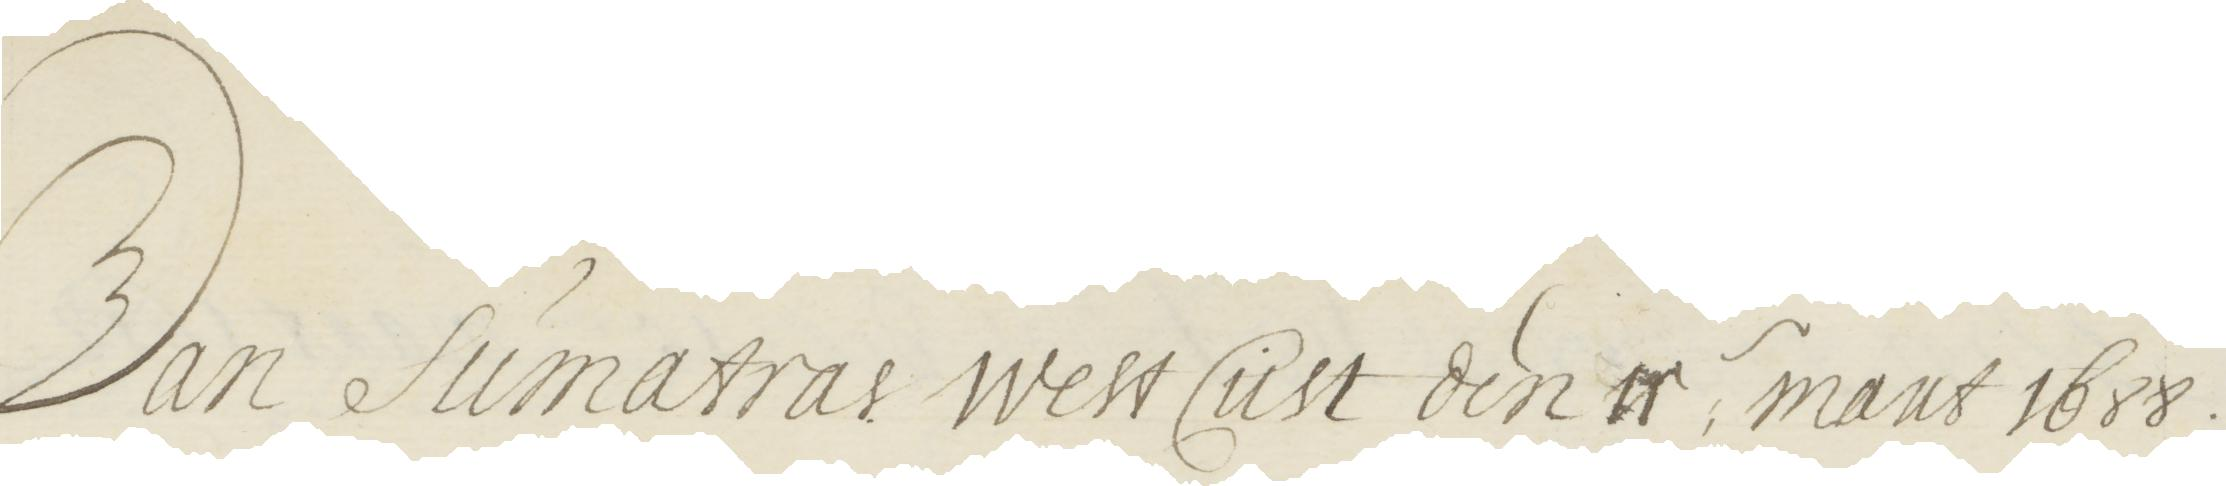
Van Sumatras west cust den 15:en mart 1688.
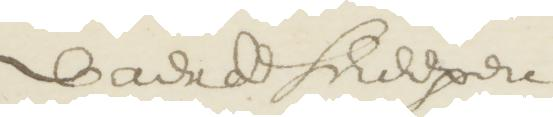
waer de scheepen
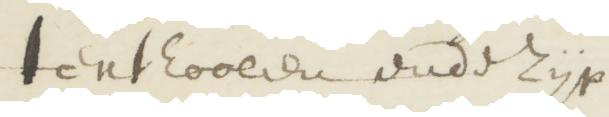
terthoolen ende zijp
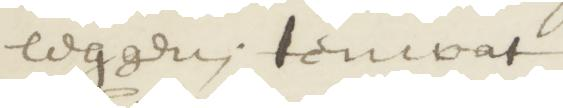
leggen; ten wat
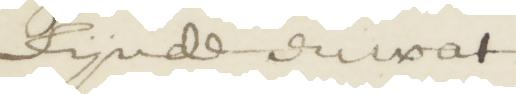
eijnde en wat
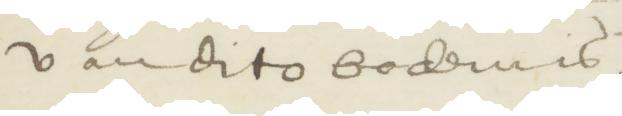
van dito bodem is
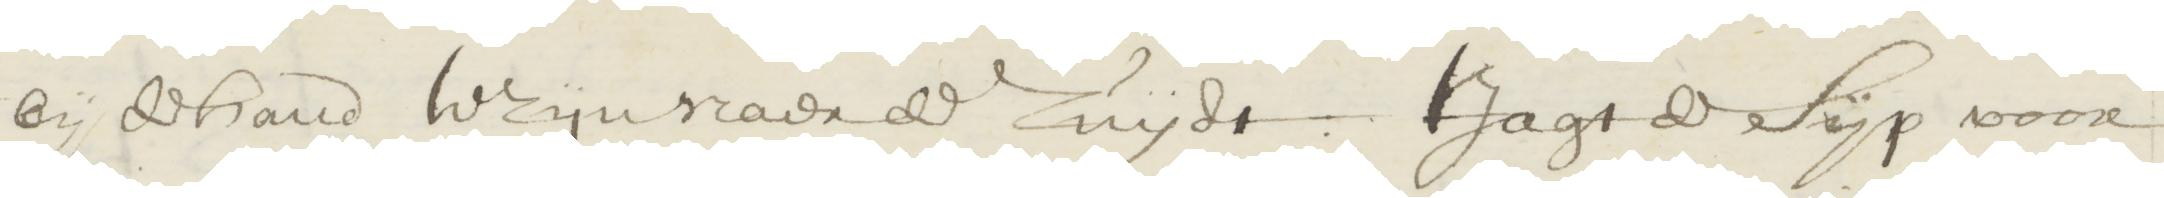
bij dehand te zijn naer de zuijdt tJagt de Sijp voor
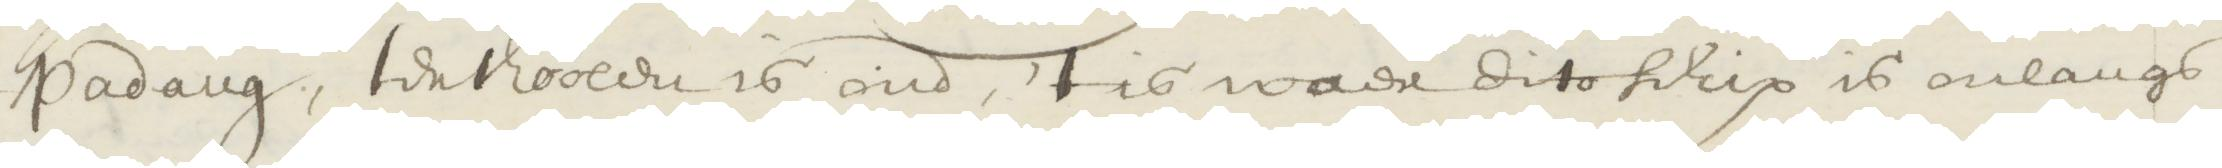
Padang, terthoolen is ond, ’t is waer dito schip is onlangs
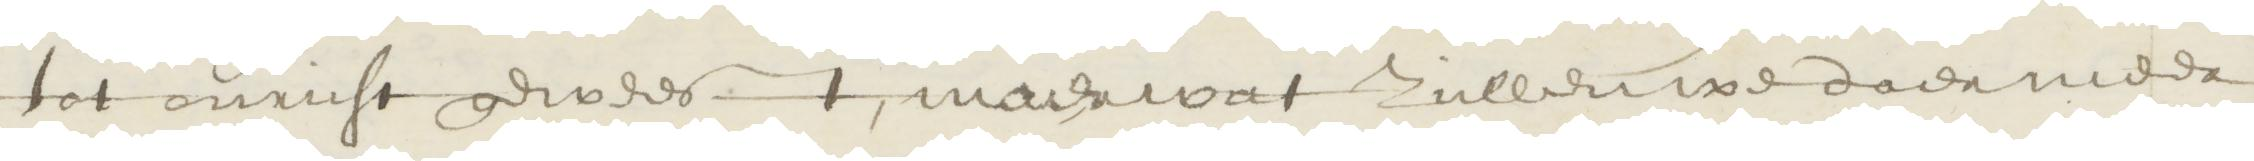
tot onricht geweest, maer wat zullen we daer meer
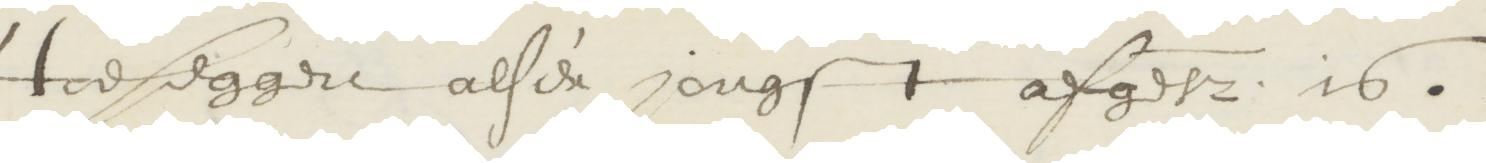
toe seggen alser jongst afgesz. is.
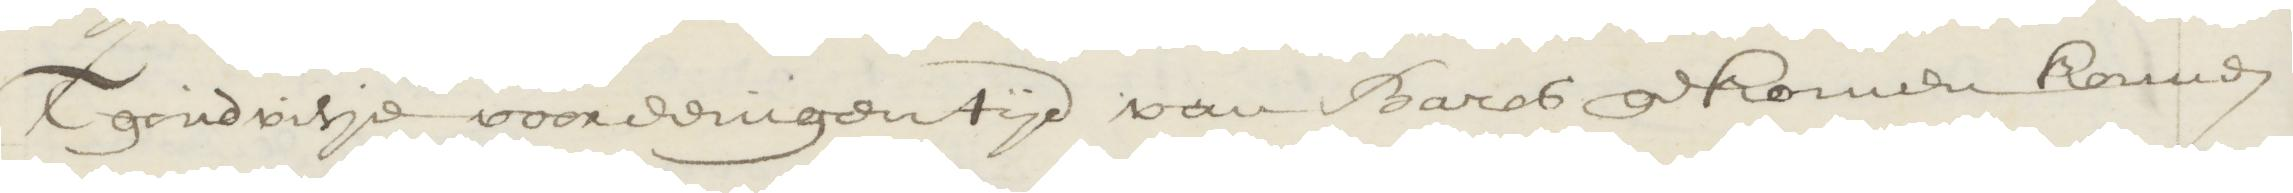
T goudvisje voor eenigen tijd van Baros gekomen konnen
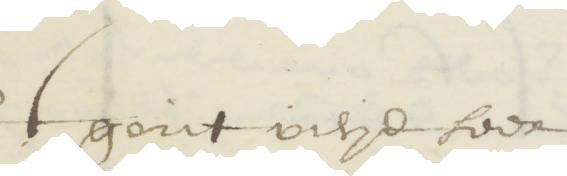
’t gout visje heer
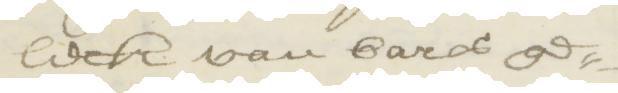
leck van baros ge„
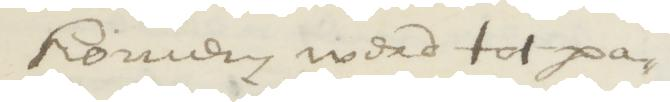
komen, werd tot pa„
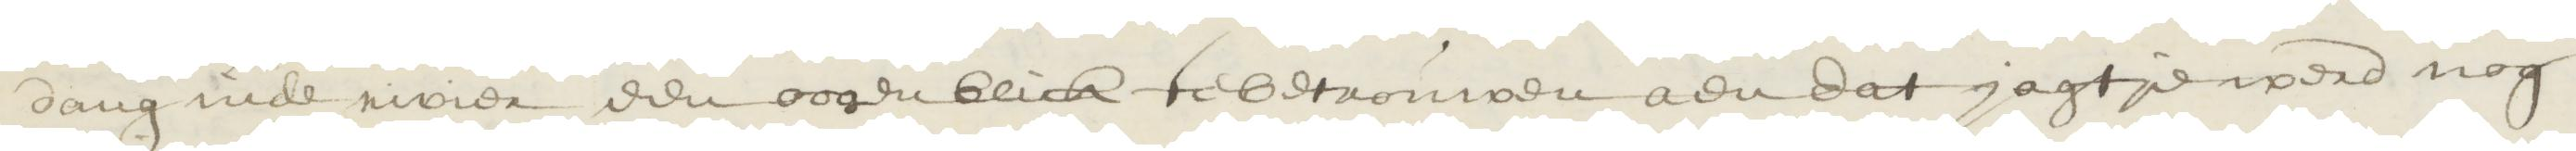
dang inde rivier een oogen blick te betrouwen aen dat jagtje werd nog
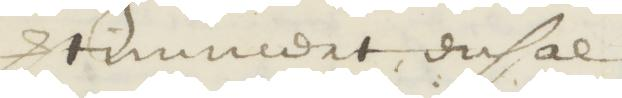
vertimmert, en sal
